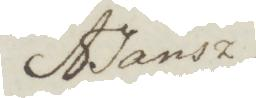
A Jansz
